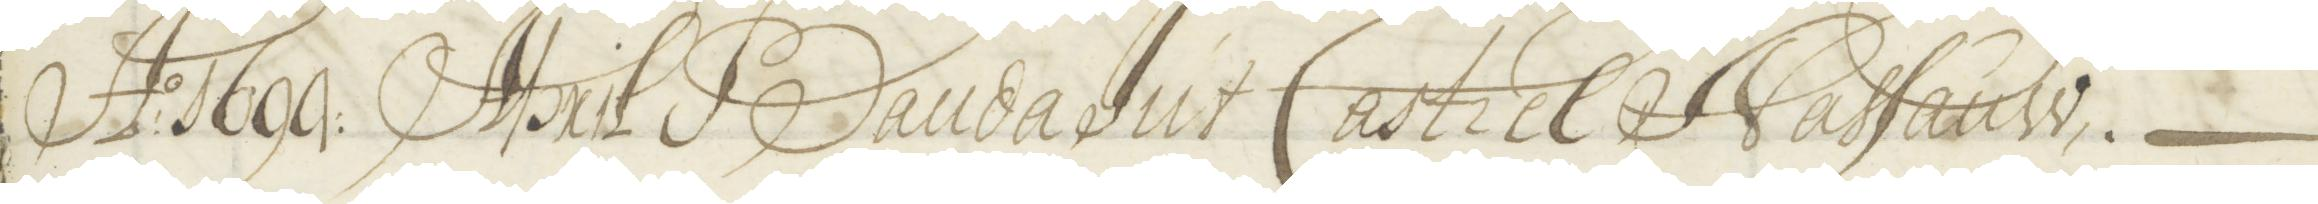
A:o 1694: April Banda In't Casteel Nassauw,. —
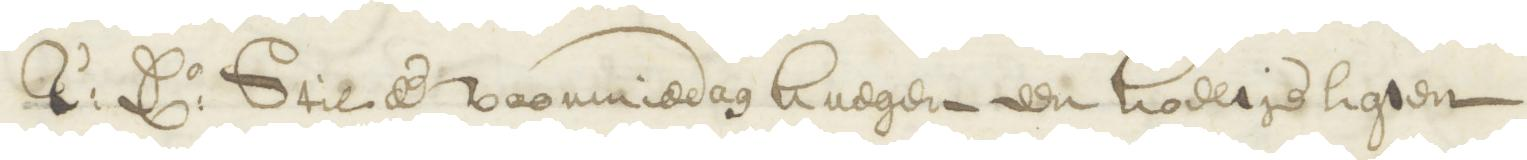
2:e D:o Stil de voormiddag kregen een koeltje ligten
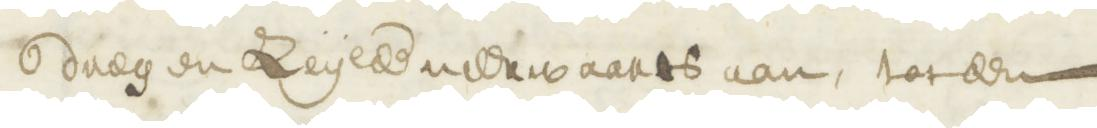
dreg en zeijlde neerwaarts aan, tot den
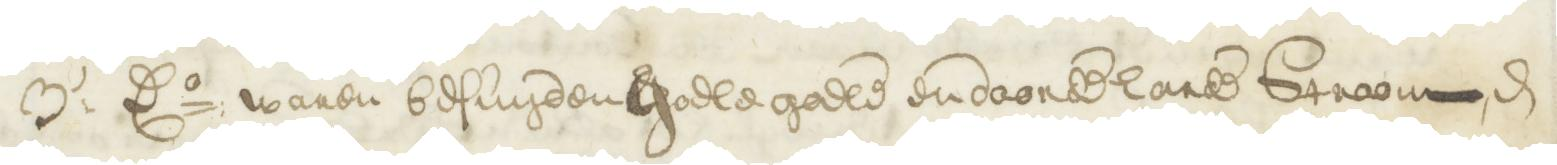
3:' D=o: waren besuyden Goele goele en door de harde Stroom, en
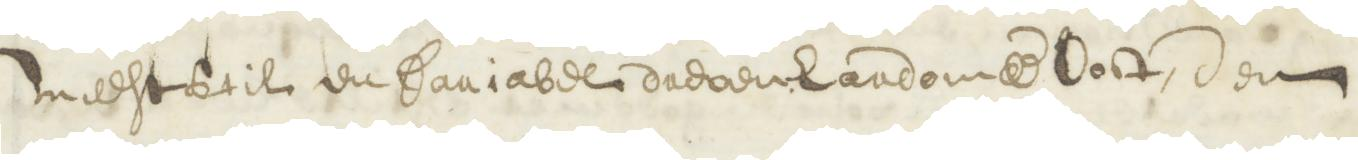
meest stil en fariabel dreven hardom de Oost, den
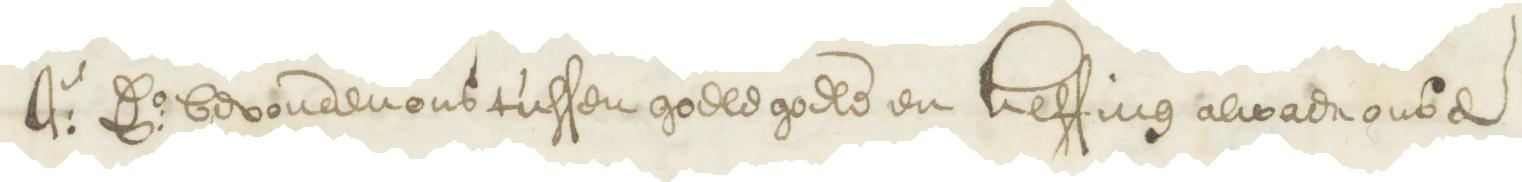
4:e D:o bevonden ons tussen goele goele en keffing alwaer ons de
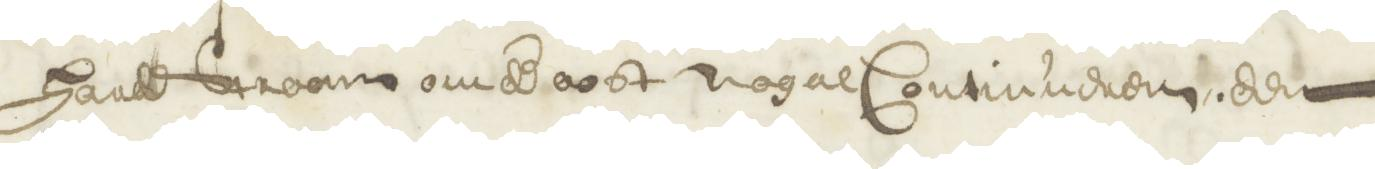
harde stroom om de oost nog al Continuerent, den
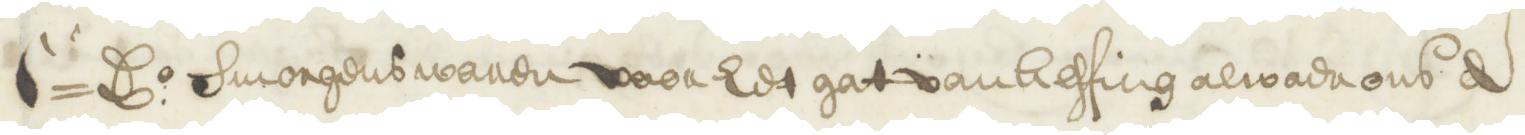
5=' D:o smorgens waren voor het gat van keffing alwaer ons de
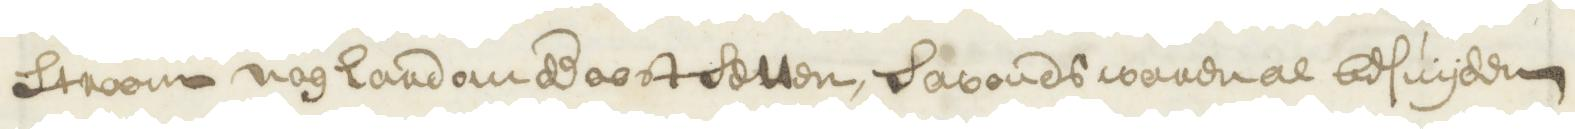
stroom nog hardom de oostsetten, savonds waren al besuijden
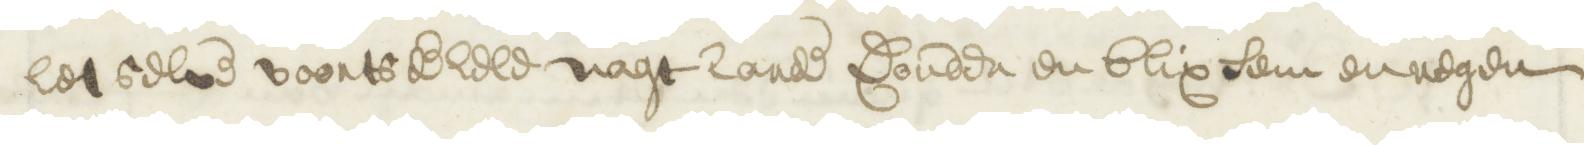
het selve voorts de hele nagt harde Donder en blix sem en regen
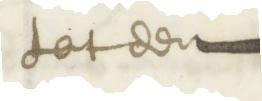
tot den
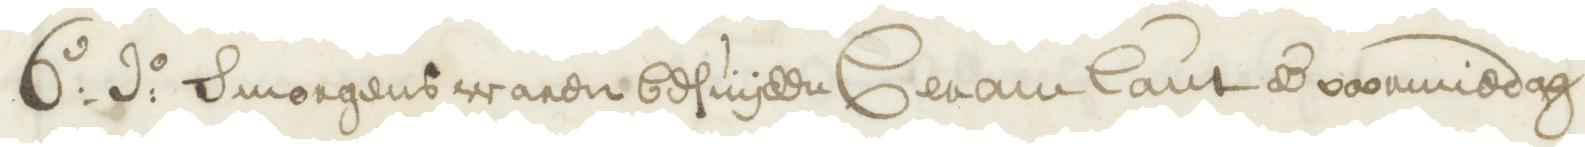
6:e d:o smorgens waren besuijden Ceram Laut de voormiddag
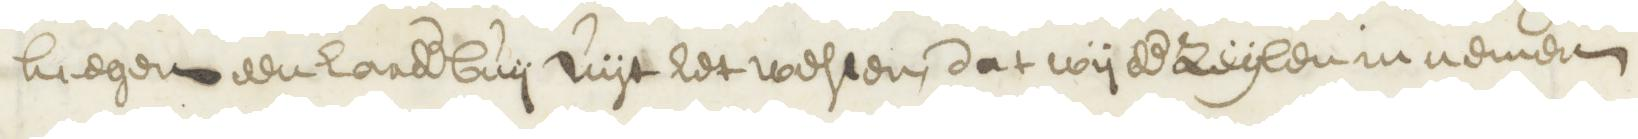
kregen een harde buij uijt het westen, dat wij de zeijlen in nemen
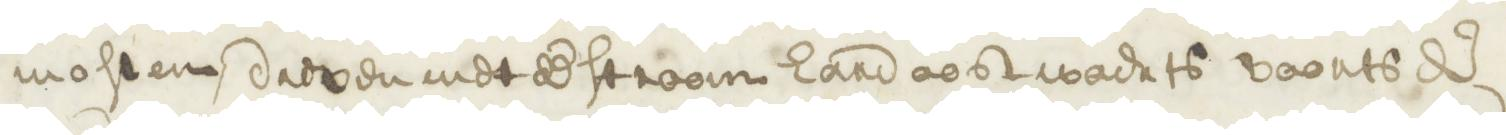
mosten, dreven met de stroom hard oost waerts voorts de
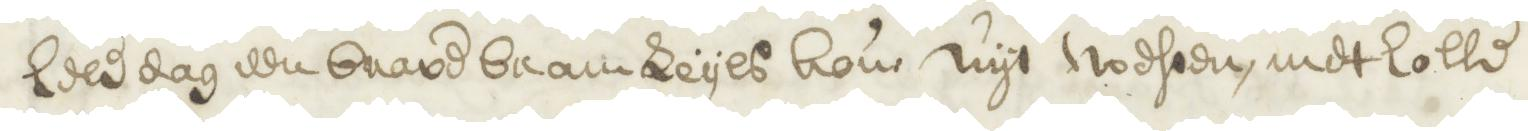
hele dag een brave bram zeijls kou uijt 't westen, met holle
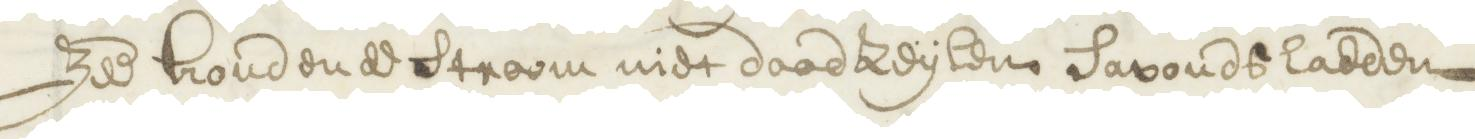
zee konden de stroom niet dood zeijlen savonds hadden
